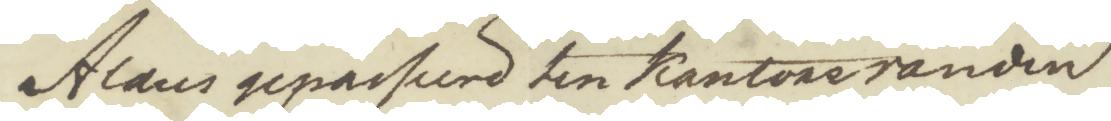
Aldus gepasseerd ten Kantore van den
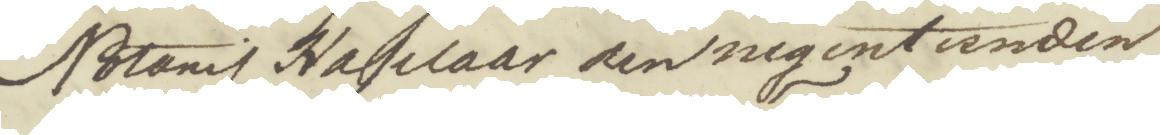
Notaris Haselaar den negentienden
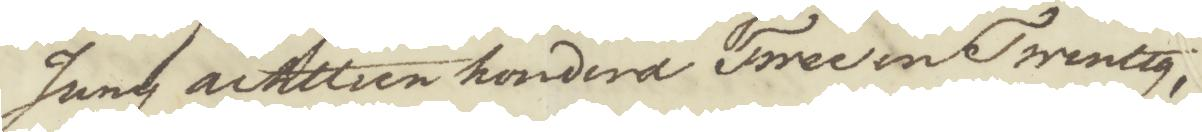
Juny achttien honderd Twee en Twintig,
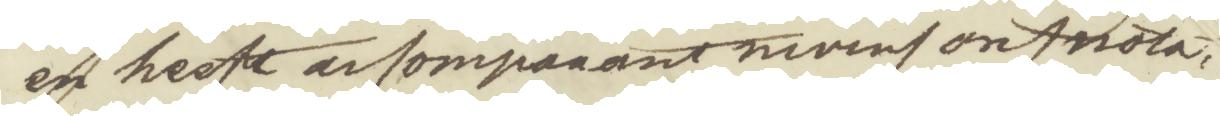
en heeft de Comparant nevens ons nota,
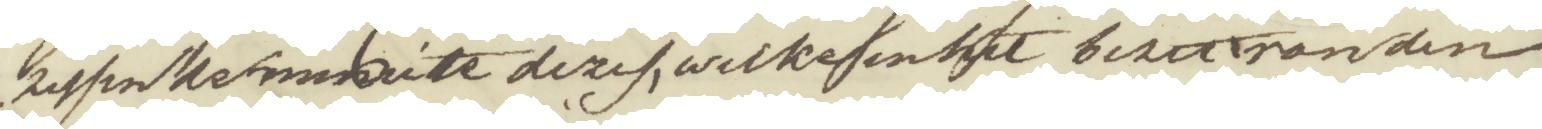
:rissen de minute dezes, welke in het bezit van den
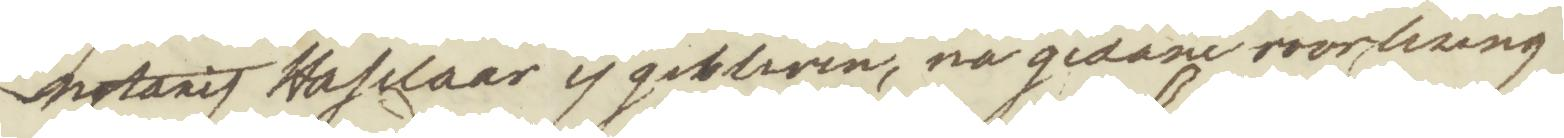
notaris Haselaar is gebleven, na gedane voorlezing
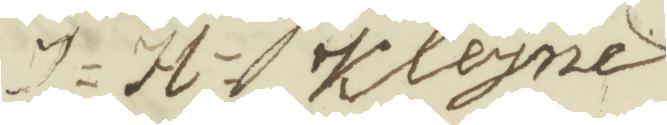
J= H= Kleyne
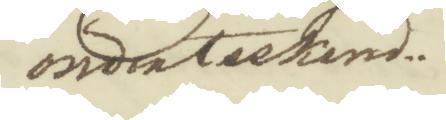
onderteekend..
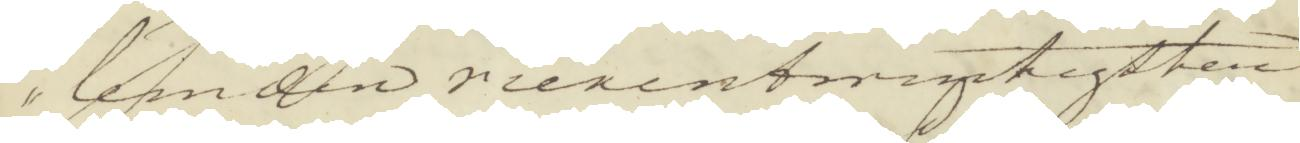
„lem den vierentwintigsten
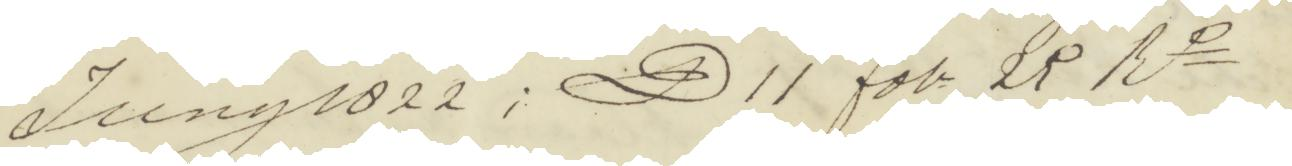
Juny 1822; D 11 fol.o 25 R=o
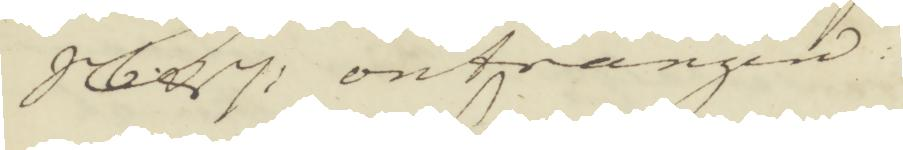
V 6: & 7: ontvangen:
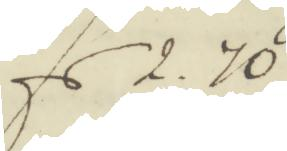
fr 2. 70
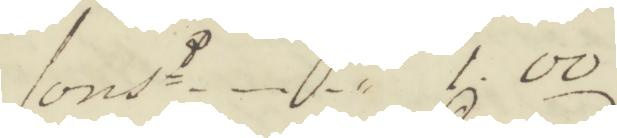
Const = - - - - „ 1. 00
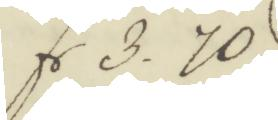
fr 3. 70
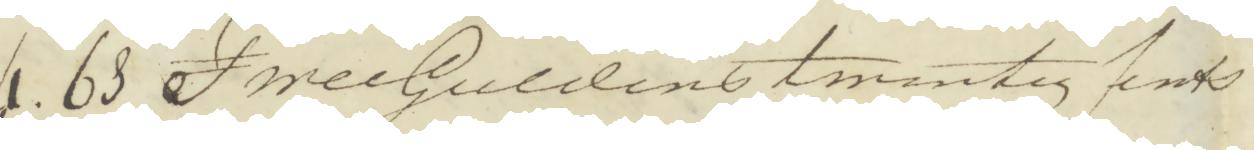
Twee Guldens twintig Cents
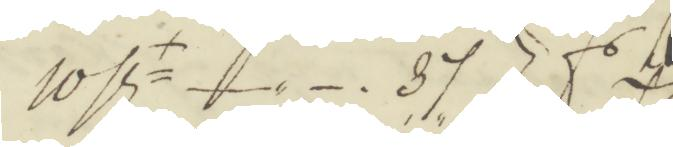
10 /C=t - - - „ – . 37 fr 4. 63
